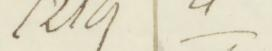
1219 4
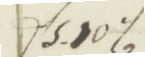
ƒ 5.10½
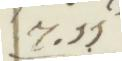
7.11
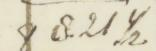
ƒ 8.21½
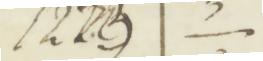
1279 5
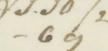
— 69
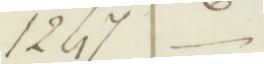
1247 6
